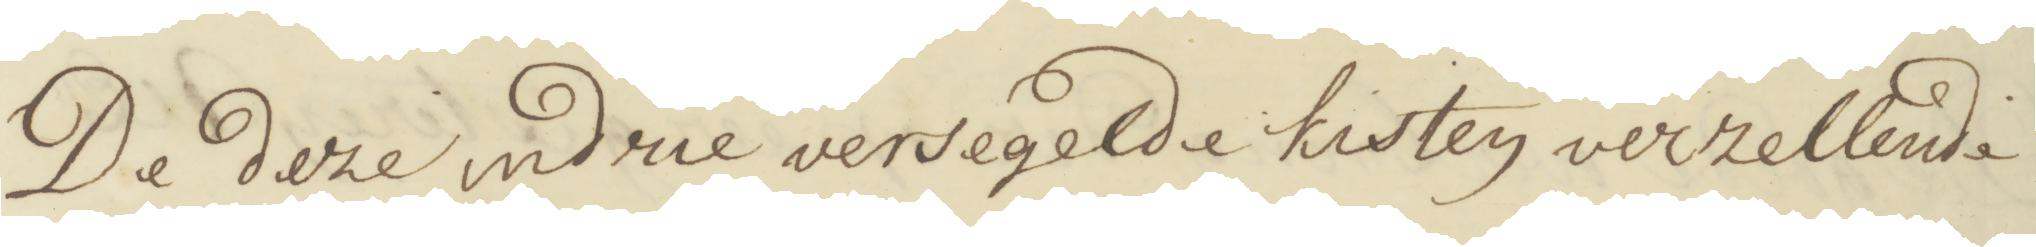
De deze indrie versegelde kisten verzellende
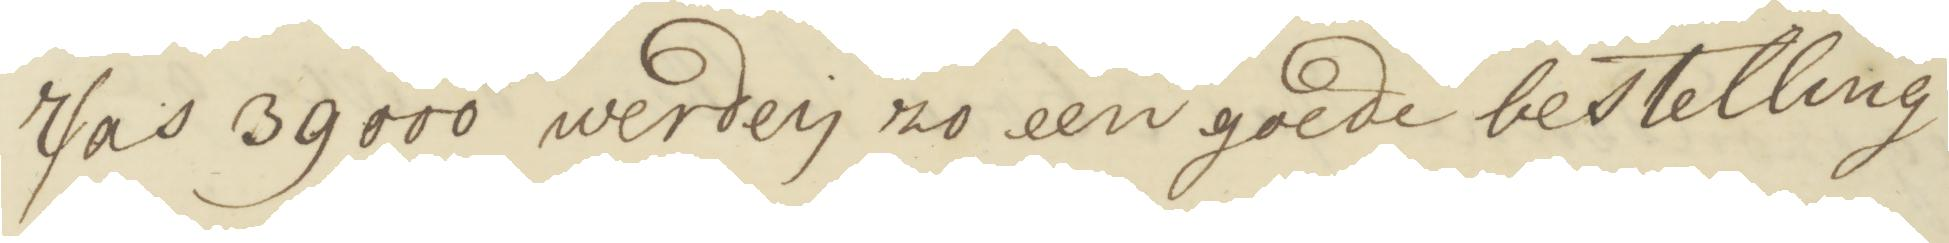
r/as 39000 werden zo een goede bestelling
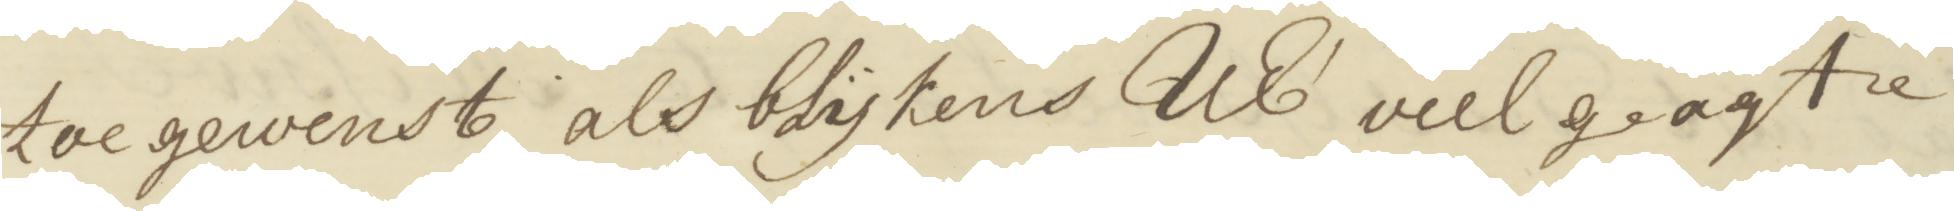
toe gewenst, als blijkens UE´ veel geagtie
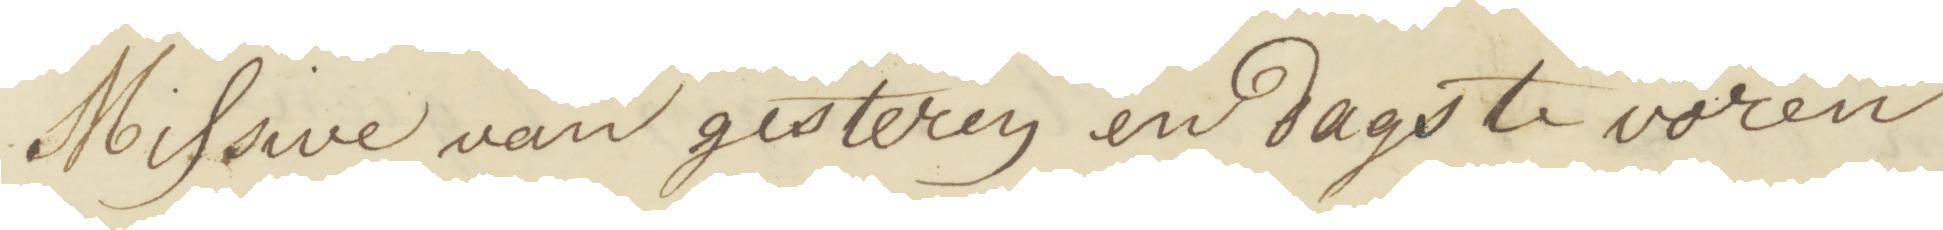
Missive van gisteren en dags te voren
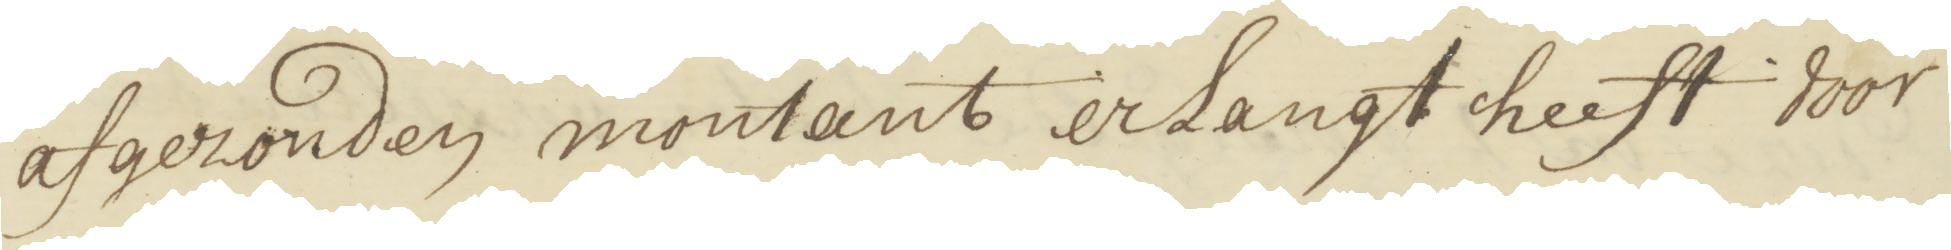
afgezonden montant erlangt heeft door
